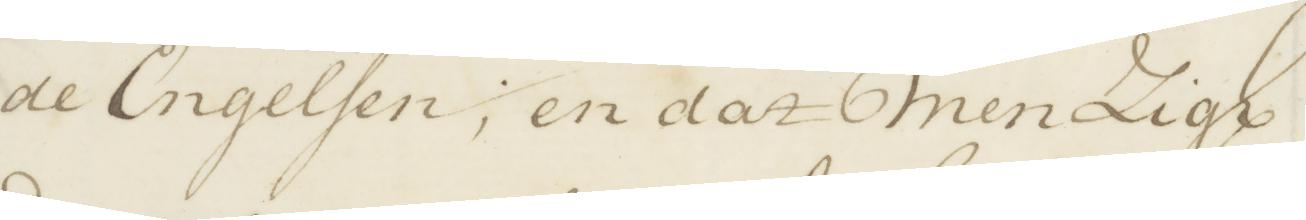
de Engelsen; en dat men zigh
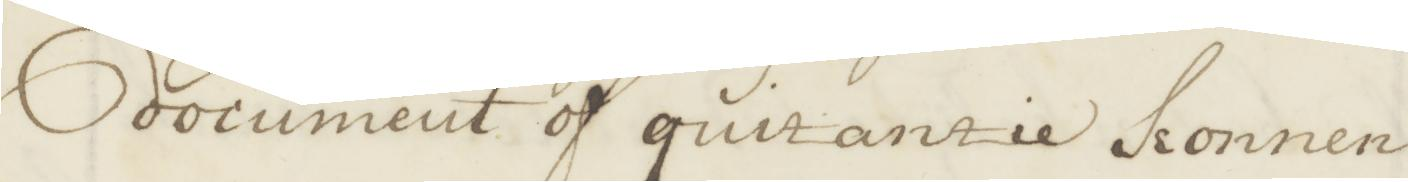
document of quitantie konnen
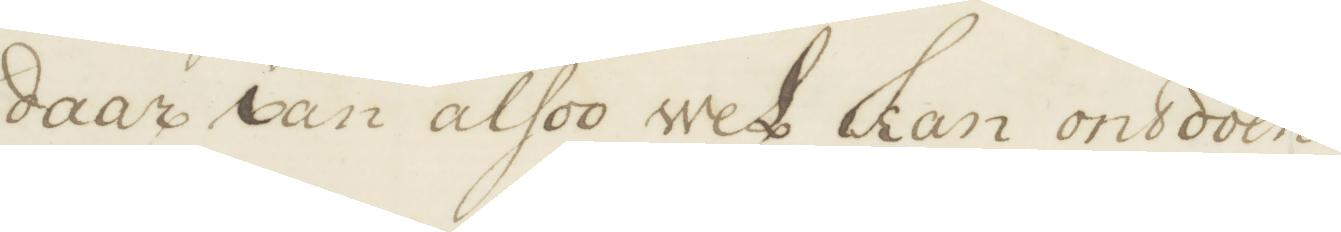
daar van alsoo wel kan ontdoen
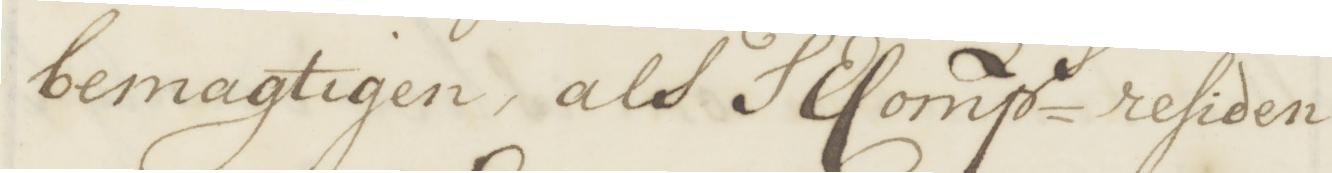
bemagtigen, als ’s EComp=s residen
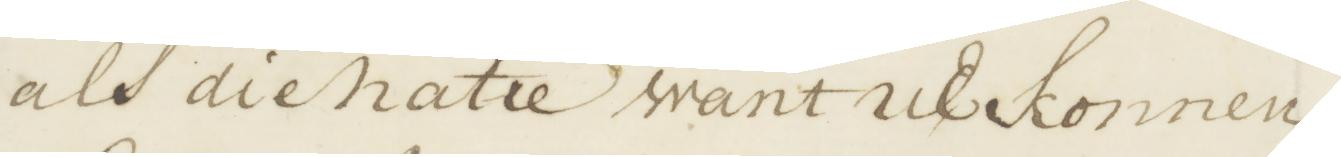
als die natie want uE konnen
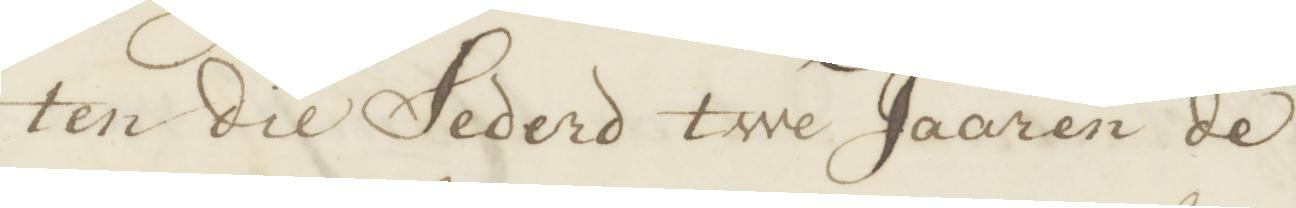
ten die sederd twe jaaren de
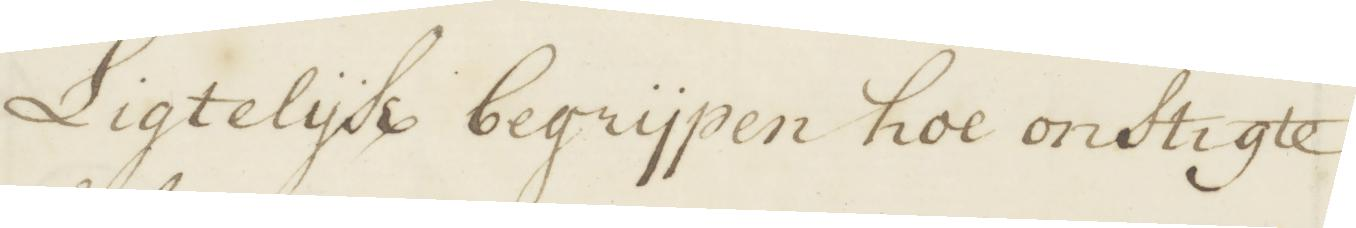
Ligtelijk begrijpen hoe onstigte
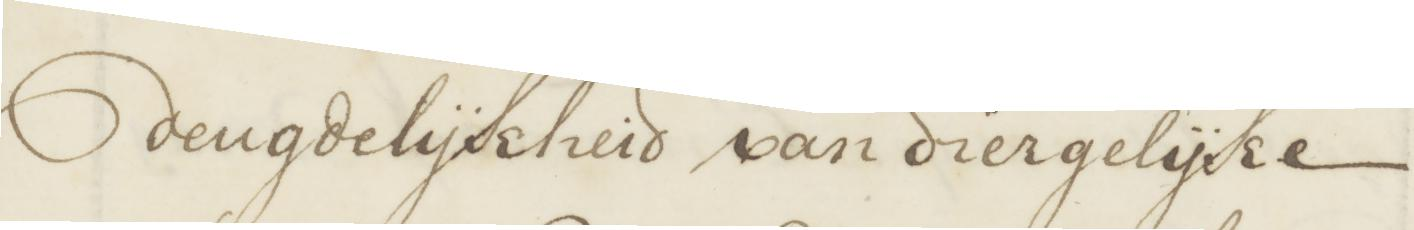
deugdelijkheid van diergelijke
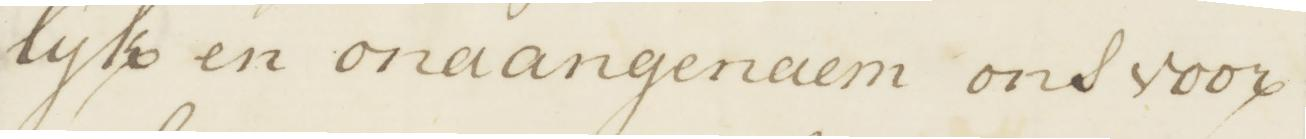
lyk en onaangenaem ons voor
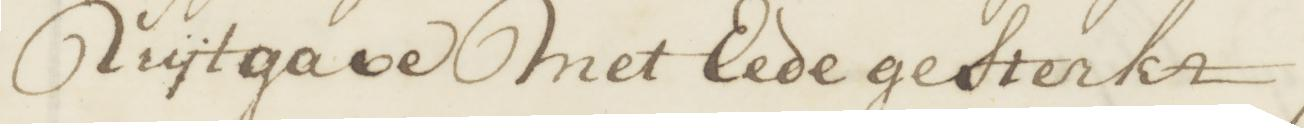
uijtgave met Eede gesterkt
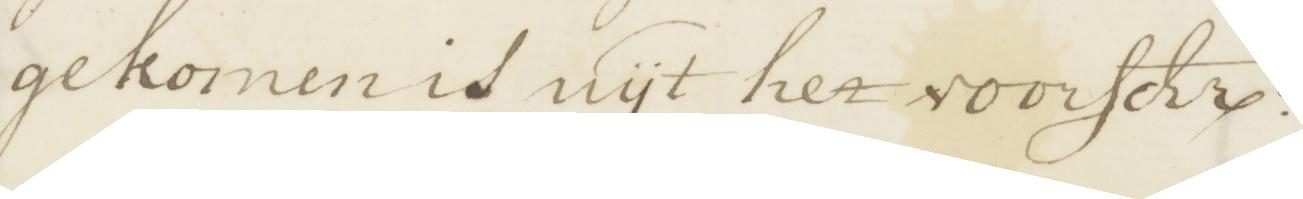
gekomen is uijt het voorschr:
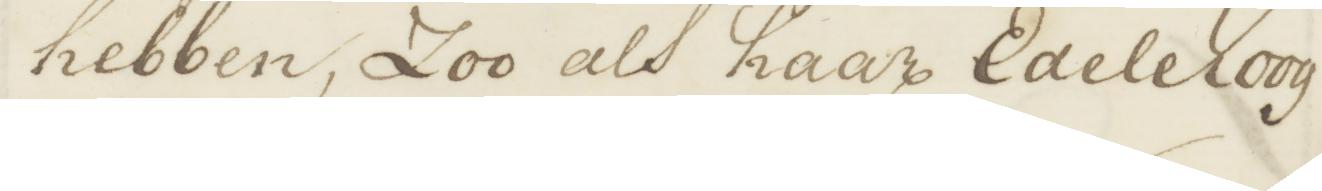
hebben, zoo als haar Edele hoog
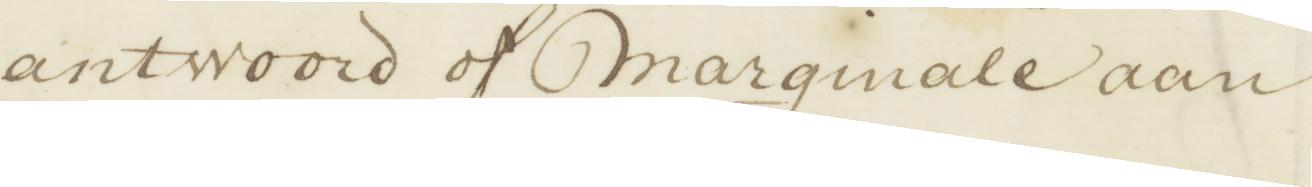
antwoord of marginale aan
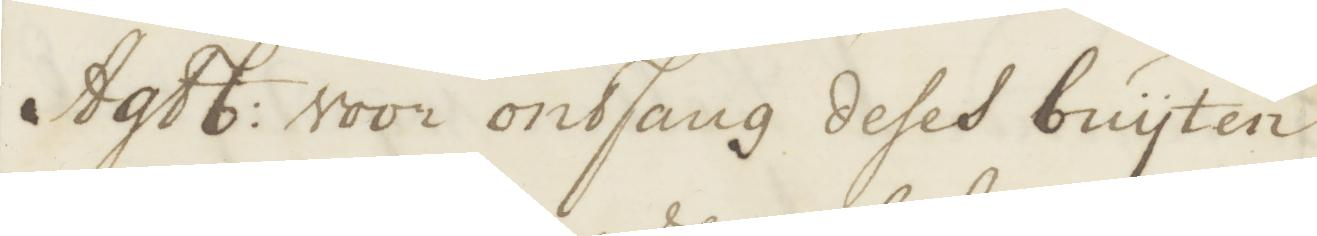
Agtb: voor ontfang deses buijten
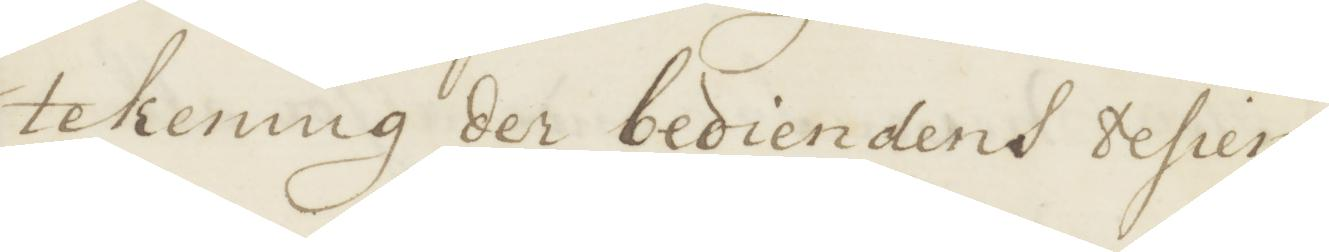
tekening der bediendens tesien
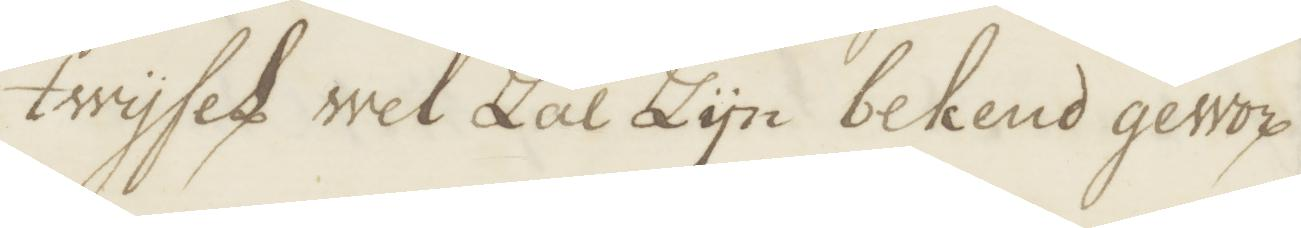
twijfel wel zal zijn bekend gewor
